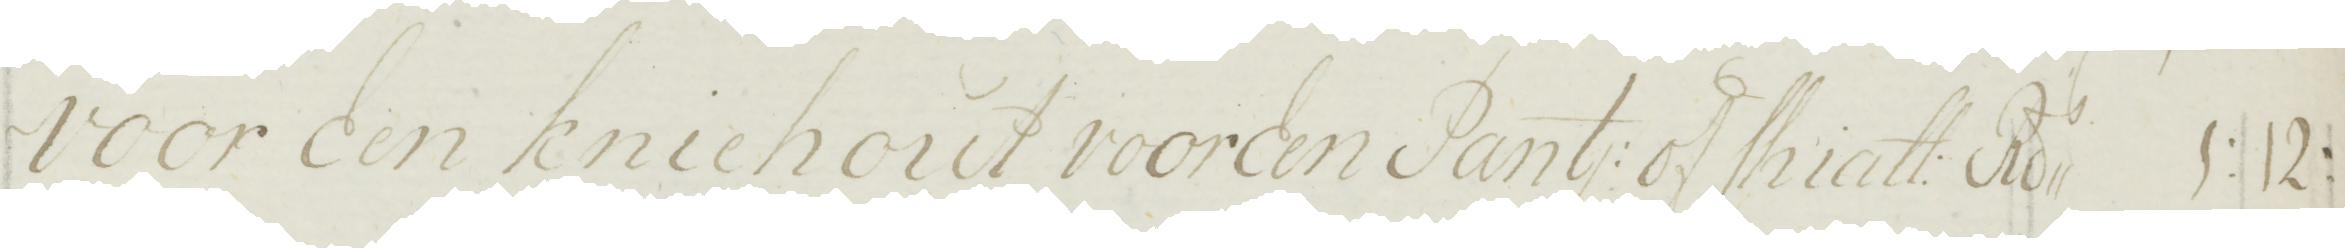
voor Een kniehout voor Een Pantj: of Chiall: Rd„s 1:12:
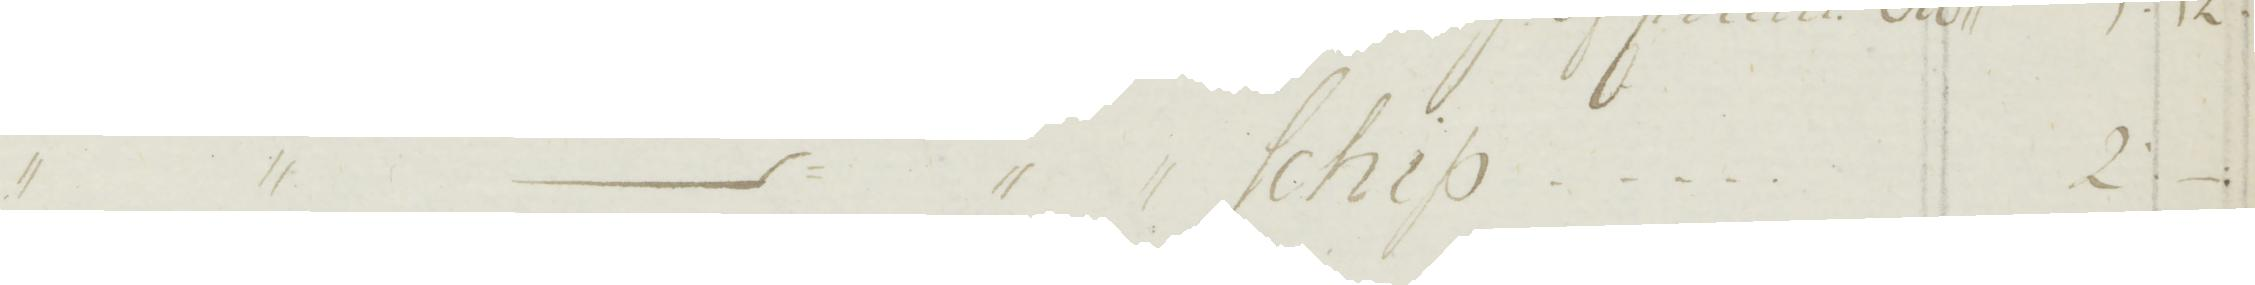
„ „ _=o „ „ schip - - - - - 2:_:
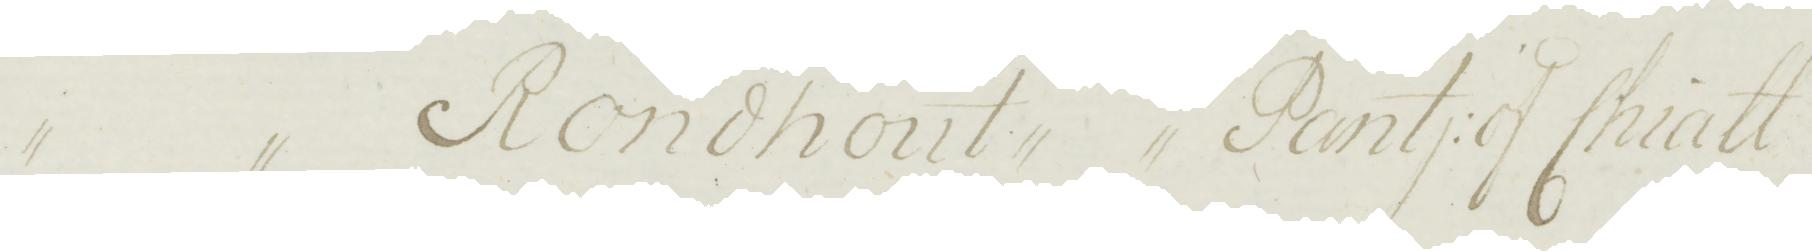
„ „ Rondhout „ „ Pantj: of Chiall
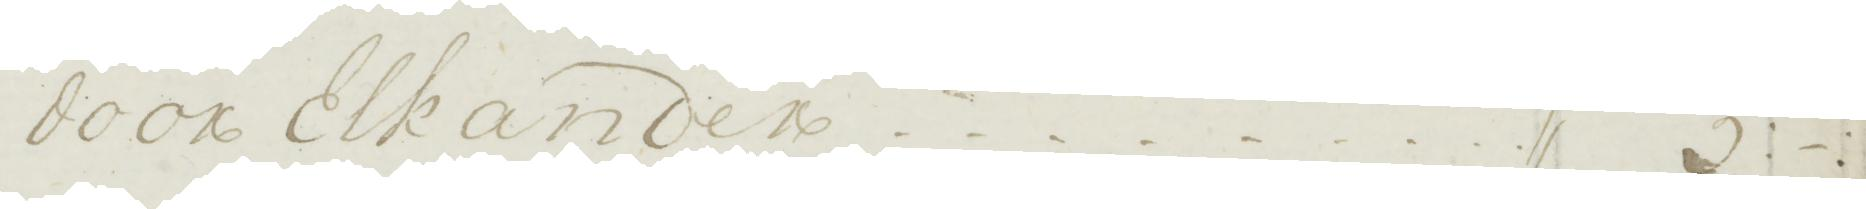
door Elkander - - - - - - - - -„ 5:-:
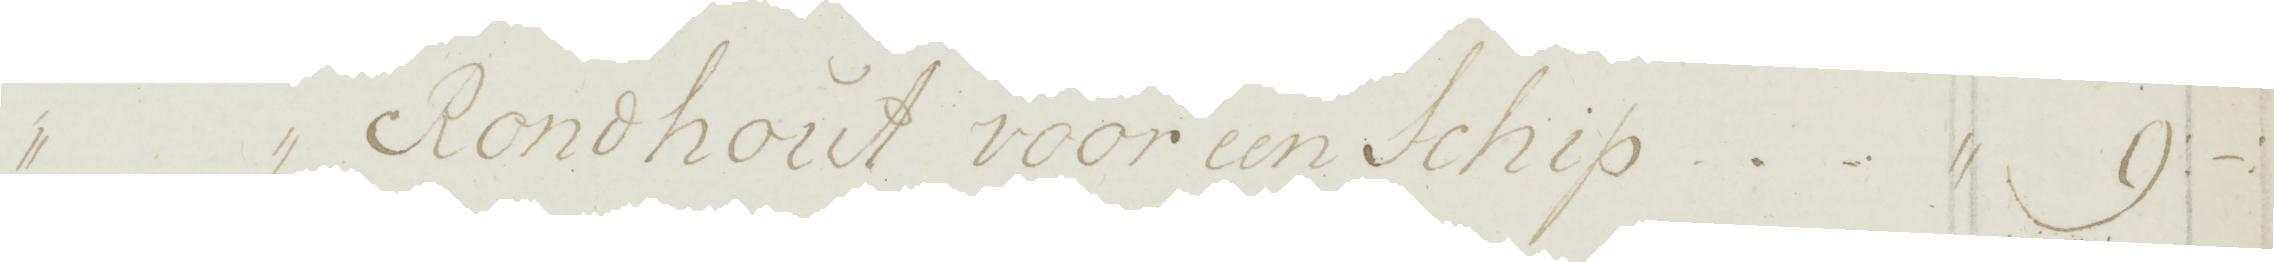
„ „ Rondhout voor een schip - - - „ 9:-
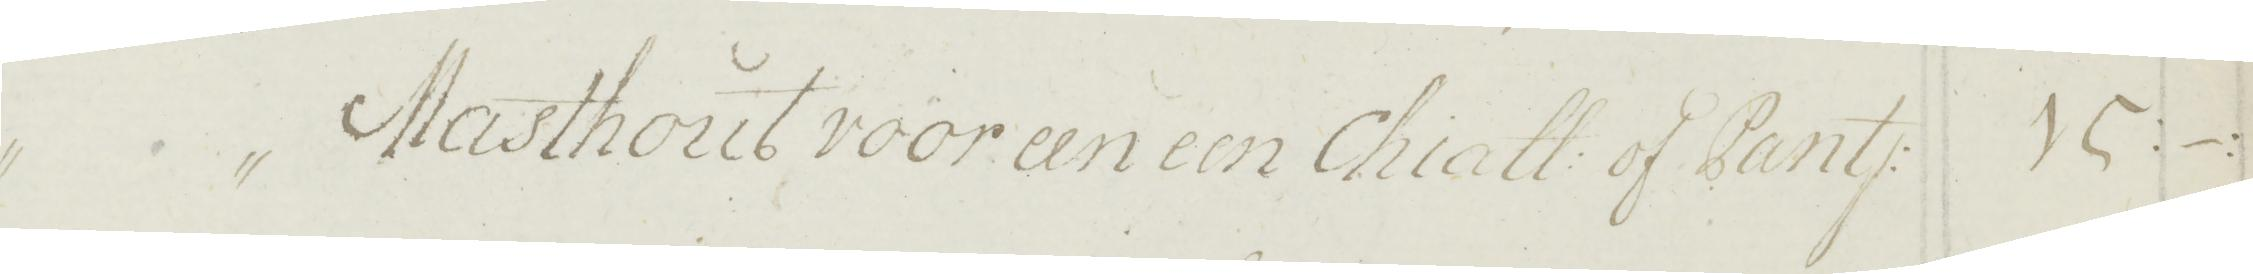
„ „ Masthout voor een een Chiall: of Pantj: 15:-:
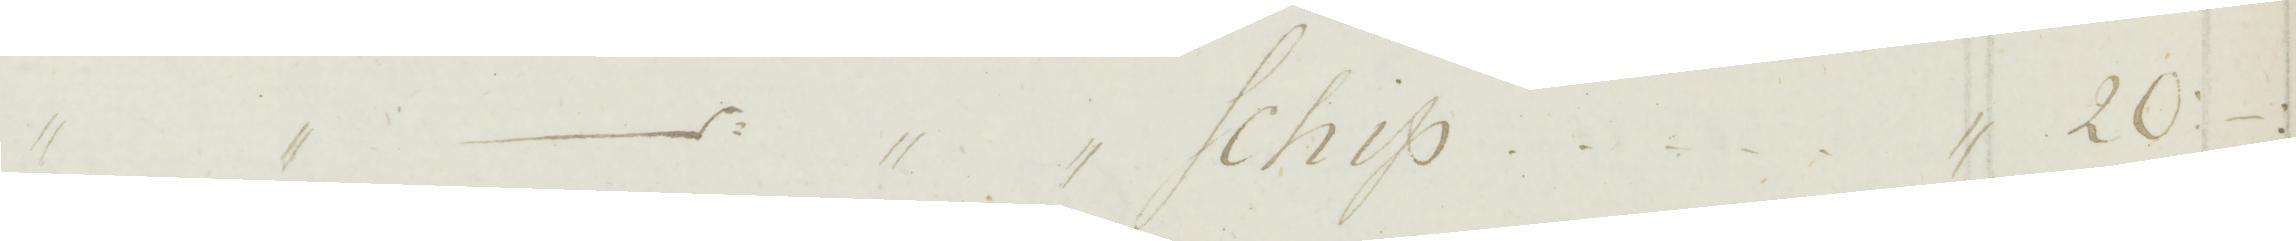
„ „ _=o „ „ schip - - - - - - „ 20:-:
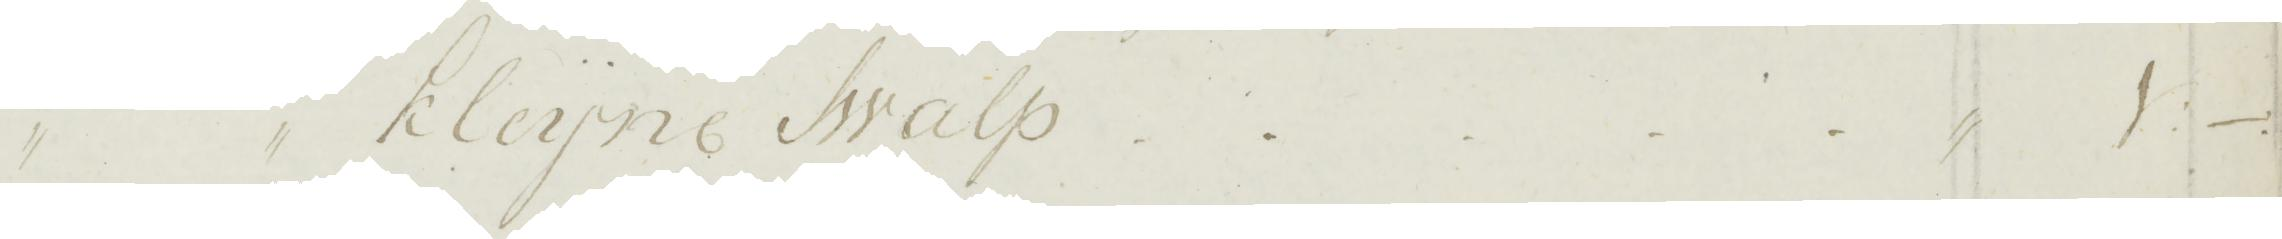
„ „ kleijne swalp - - - - - „ 1:—
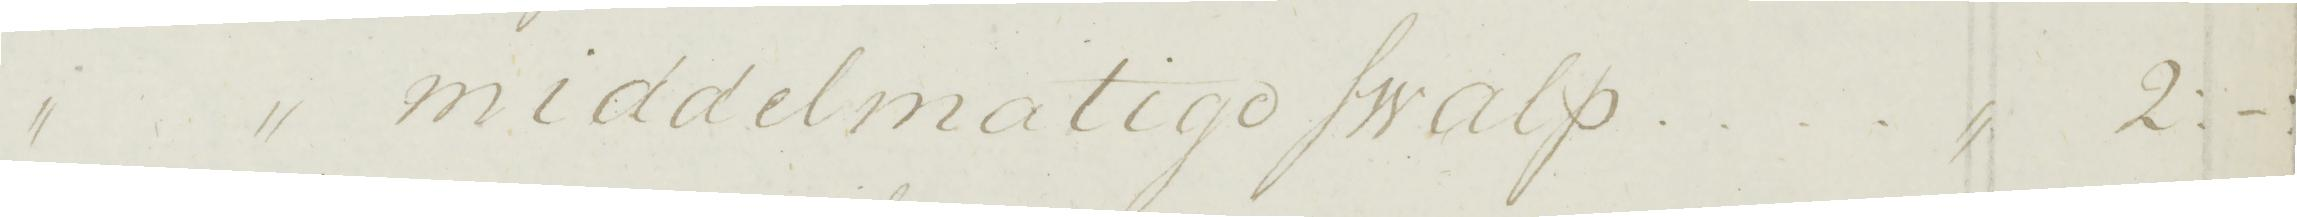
„ „ middelmatige swalp - - - - „ 2:-:
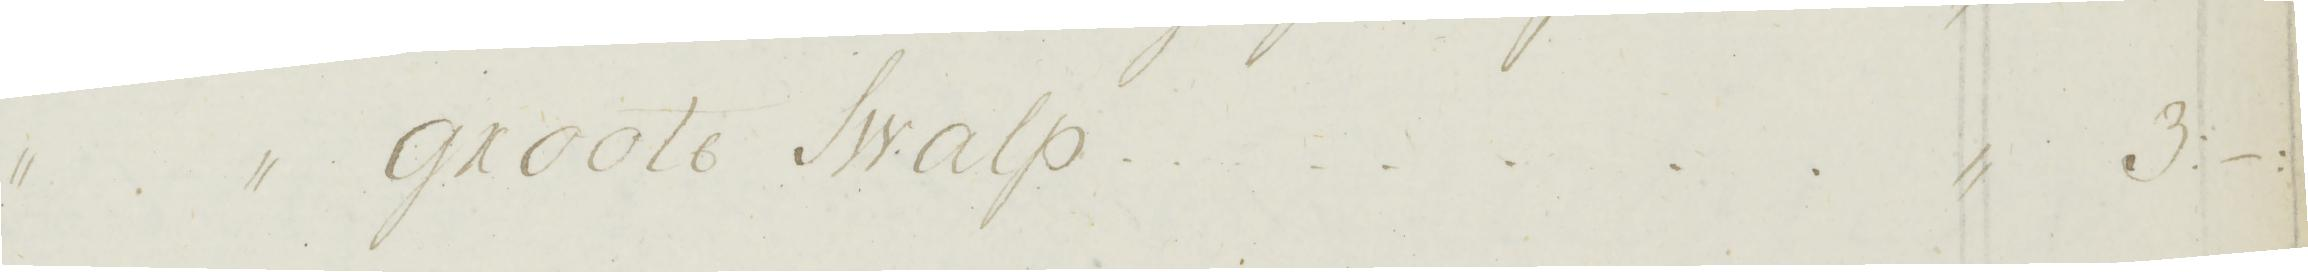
„ „ groote swalp - - - - - - - „ 3:-:
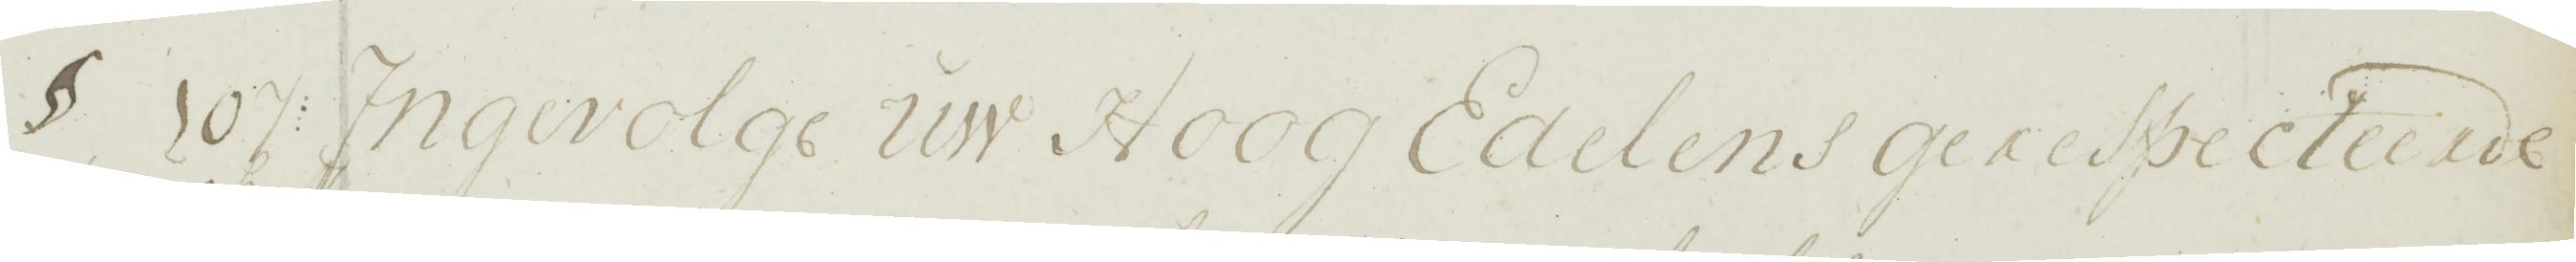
§ 107: Jngevolge uw Hoog Edelens gerespecteerde
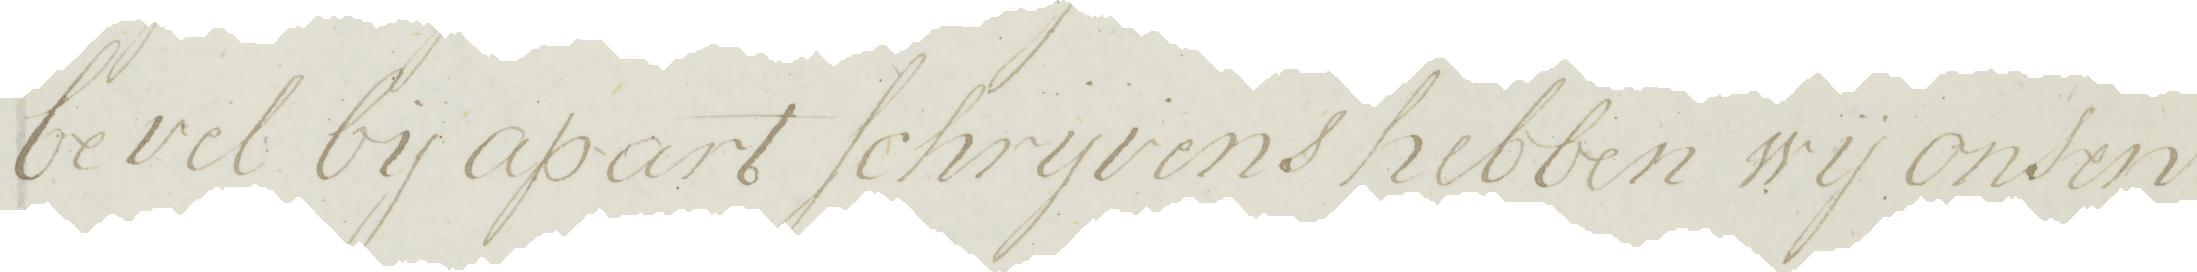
bevel bij apart schrijvens hebben wij onsen
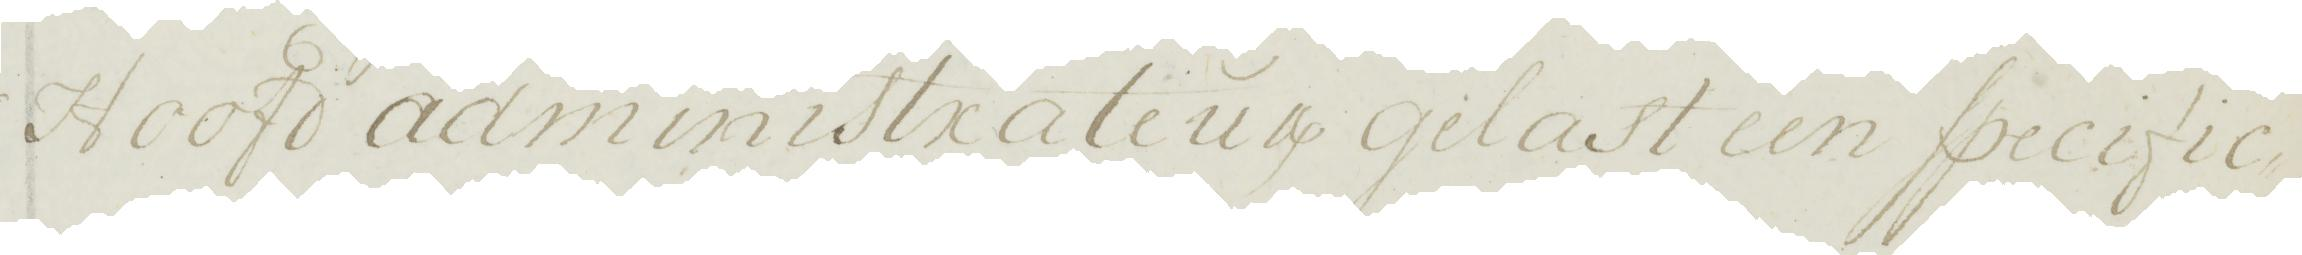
Hoofd administrateur gelast een specific„
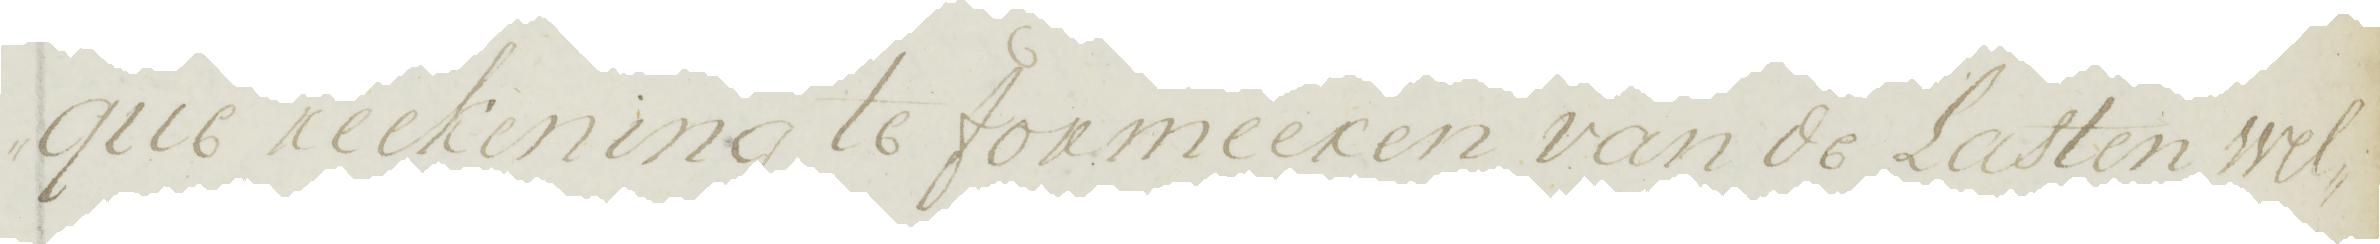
„que reekening te formeeren van de Lasten wel„
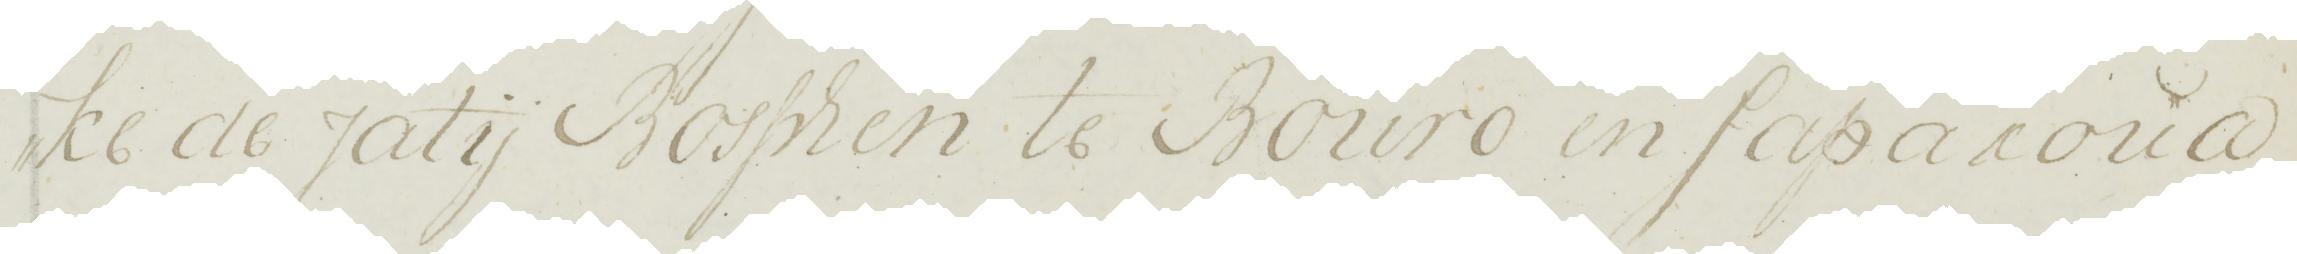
„ke de jatij Bosschen te Bouro en Saparoua
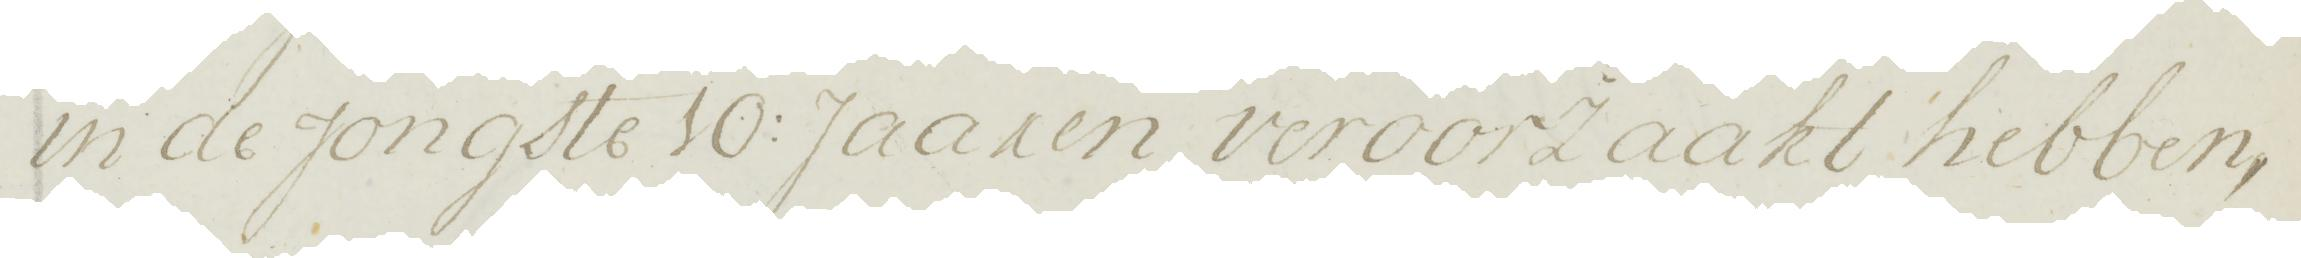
in de jongste 10: jaaren veroorzaakt hebben,
